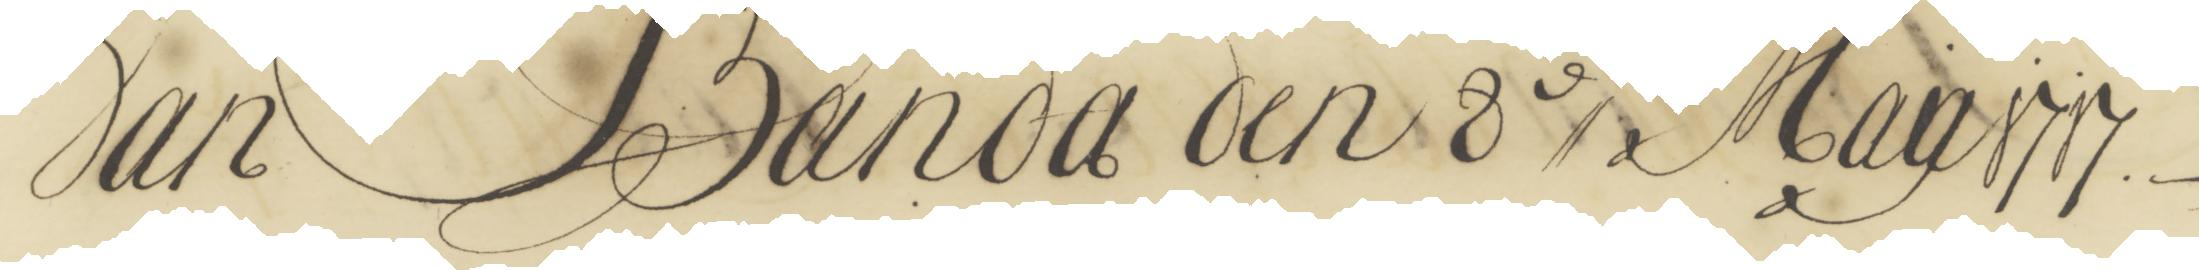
Van Banda den 8„e Maij 1717. —
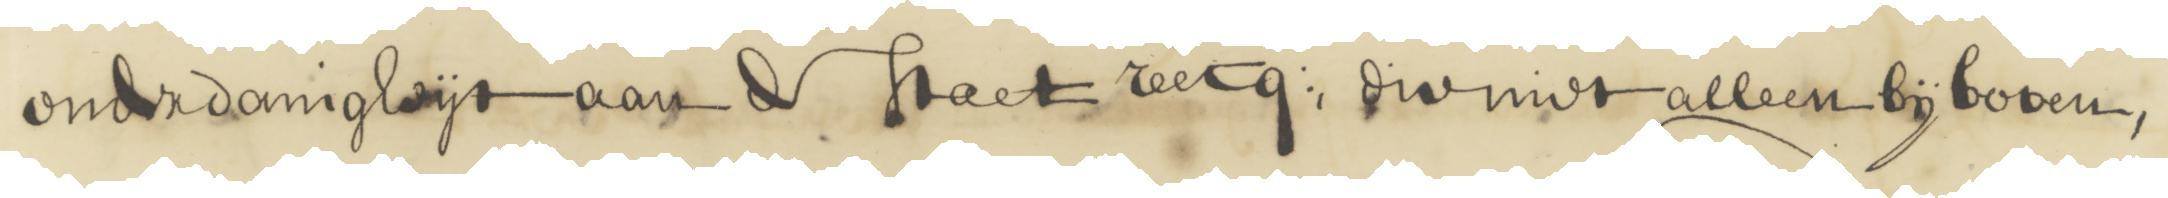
onder danigheijt aan de staet reecq: die niet alleen bij boven,
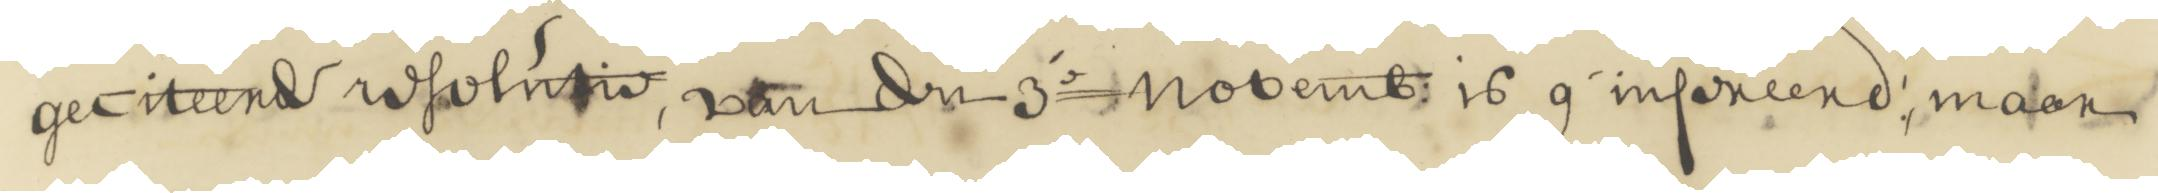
geciteerde resolutie, van den 3=e novemb: is g’insereerd, maar
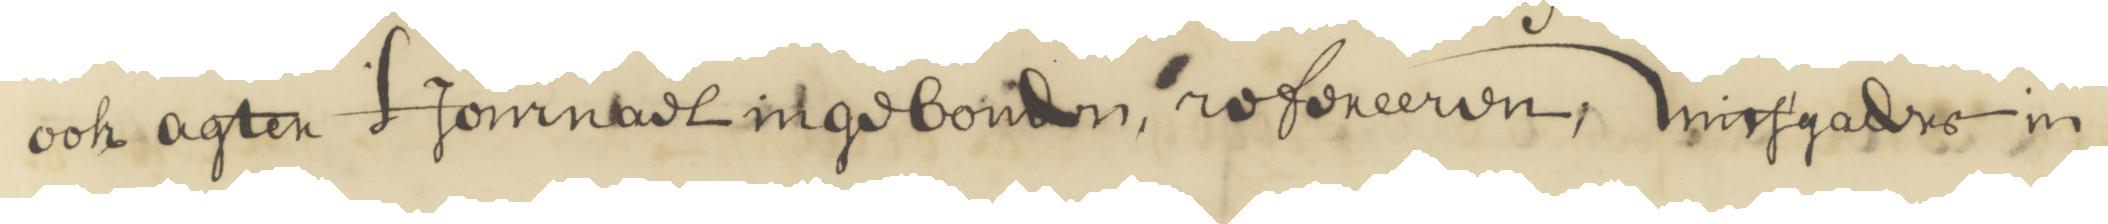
ook agter 't Journael ingebonden, refereeren, mitsgaders in
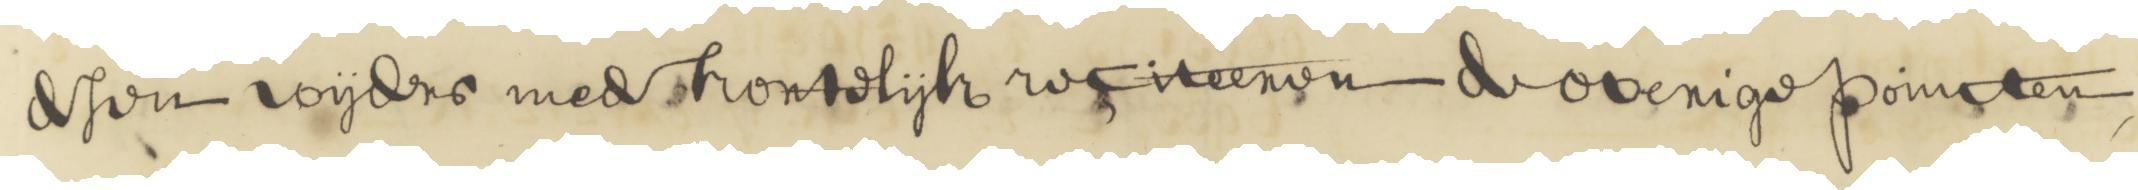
desen wijders medekortelijk reçiteeren de overige poincten
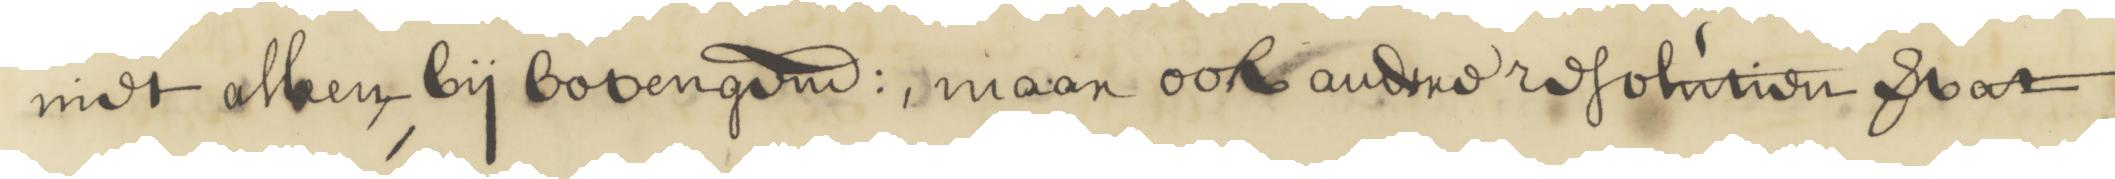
niet alleen bij bovengem:, maar ook andere resolutien vervat
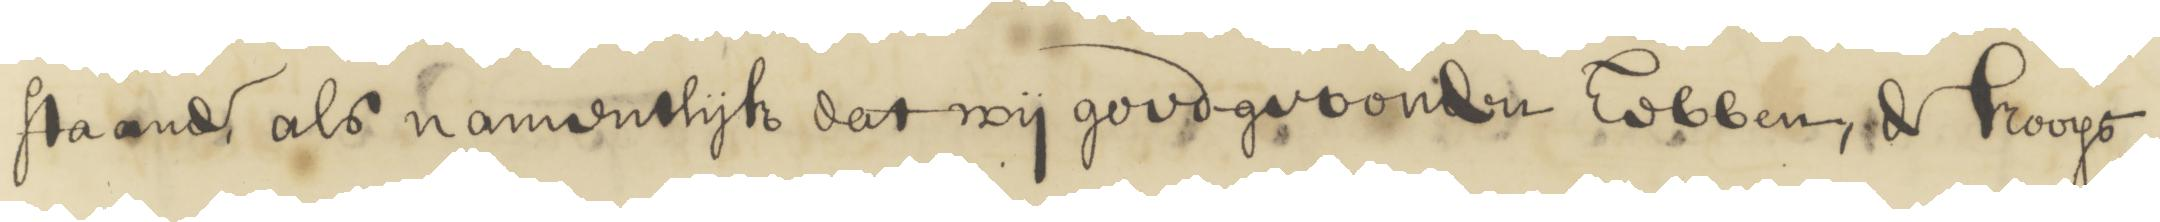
staande, als namentlijk dat wij goed gevonden hebben, de koops
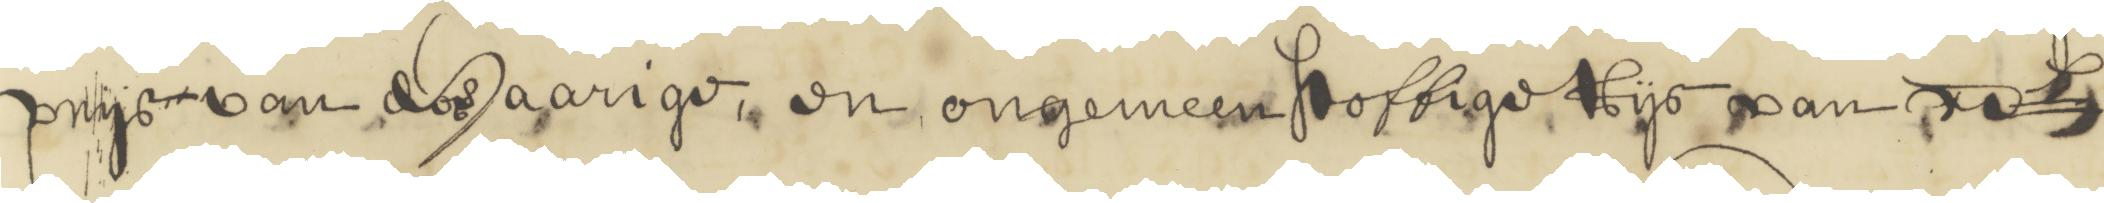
prijs van d'overjaarige, en ongemeen stoffige Rijs van rd=s
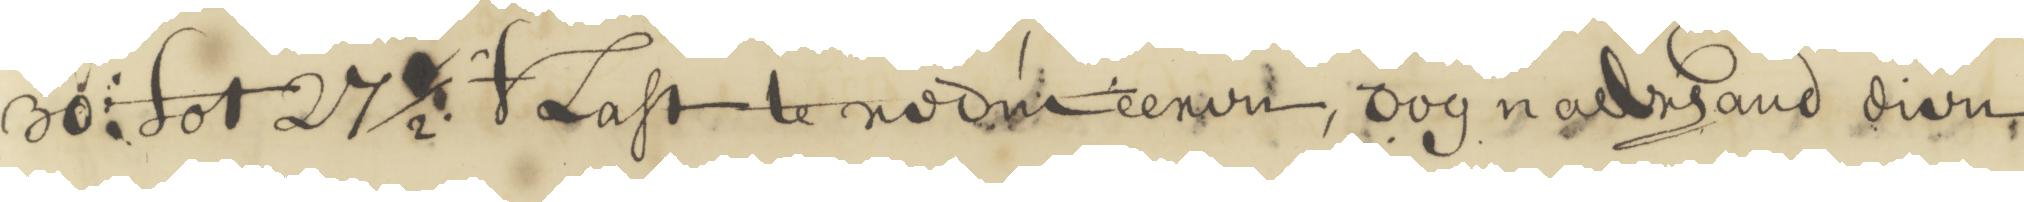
30: tot 27½: 't Last te reduceeren, dog naderhand dien
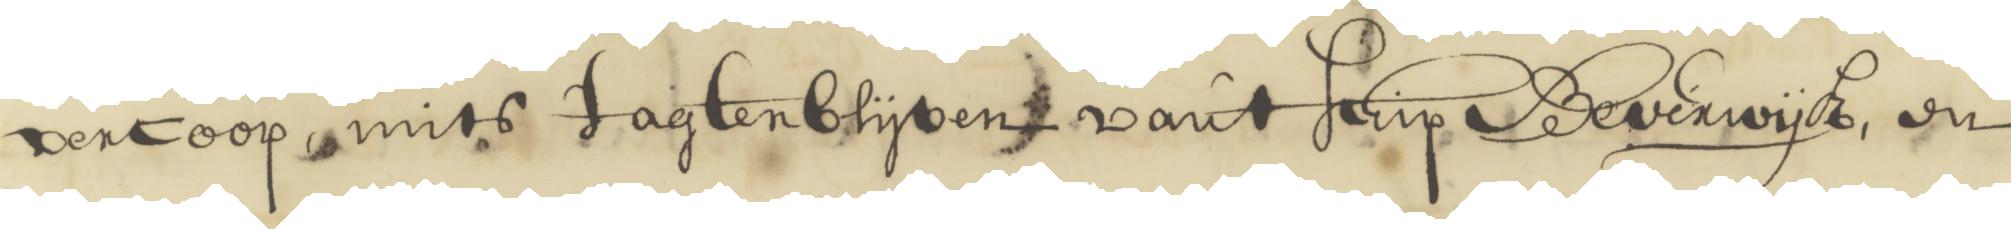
vercoop, mits 't agterblijvens van't schip Beverwijk, en
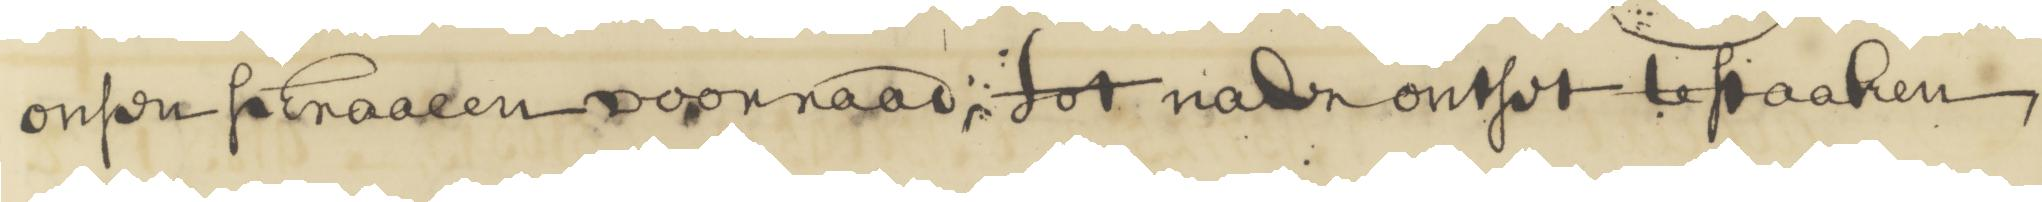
onsen schraalen voorraad, tot nader ontset te staaken
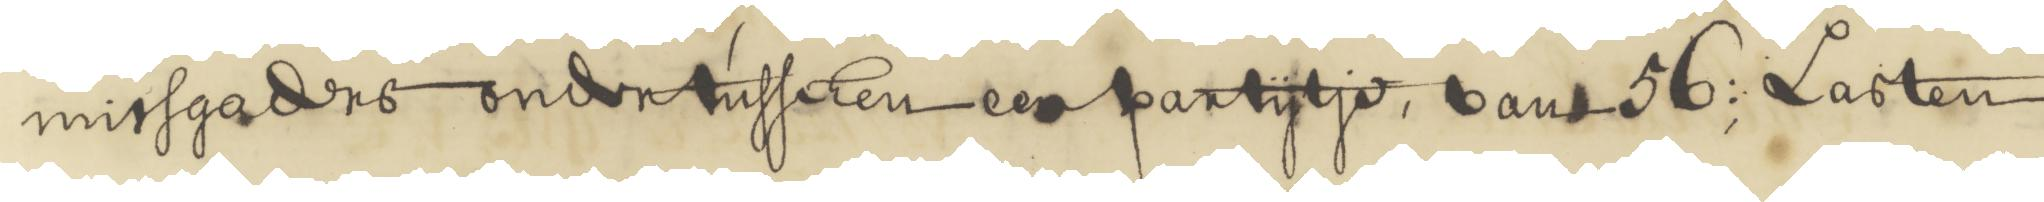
mitsgaders ondertusschen een partijtje, van 56: Lasten
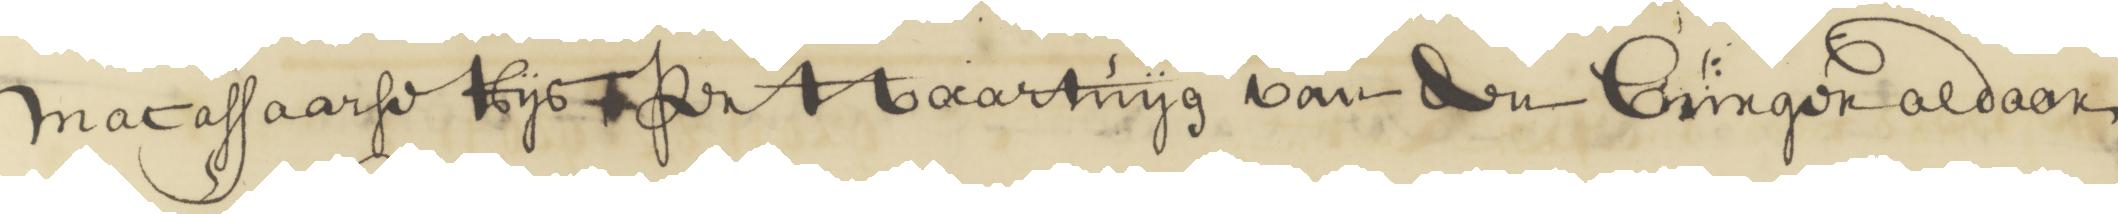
macassaarse Rijs per 't vaartuijg van den bringer aldaar
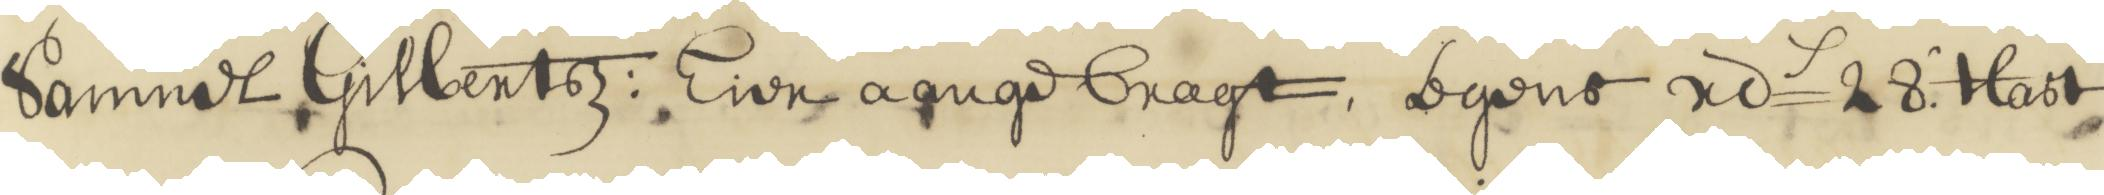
Samuel Gilbertsz: hier aangebragt, tegens rd=s 28. 't last
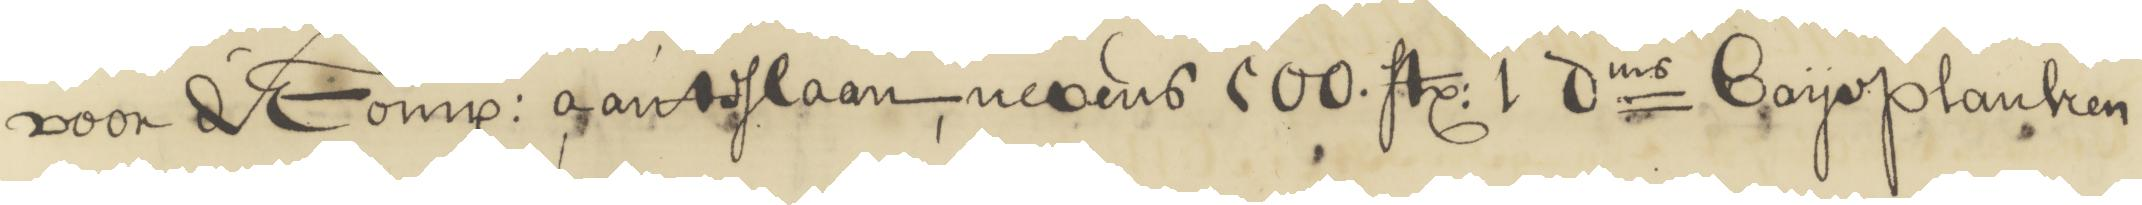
voor d'EComp: aanteslaan, nevens 500. stx: 1 d=ms baijeplanken
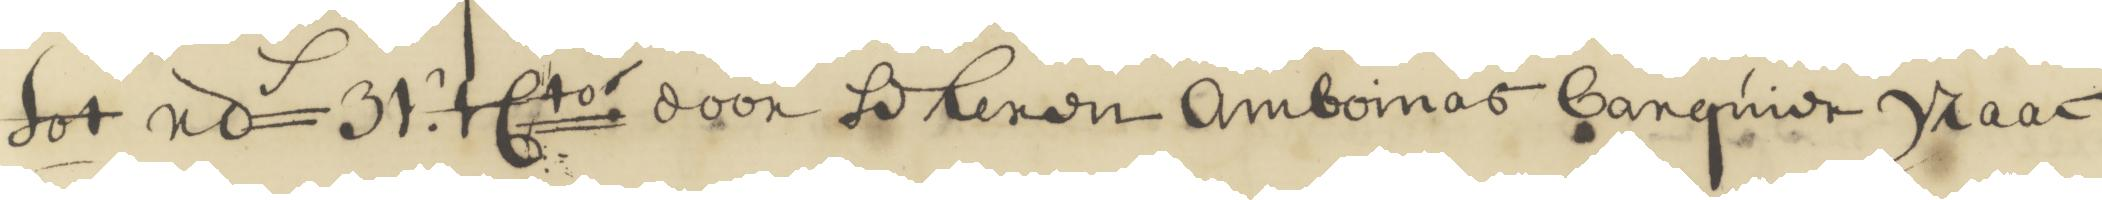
tot rd=s 31. 't C=tos door sekeren amboinas barquier Jzaac
